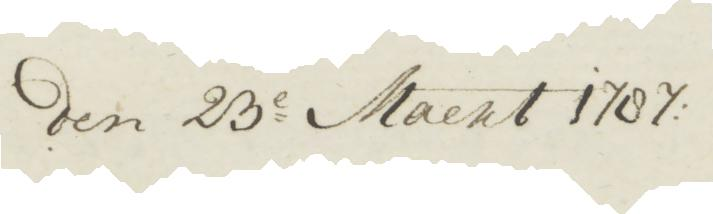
den 23=e Maert 1787:
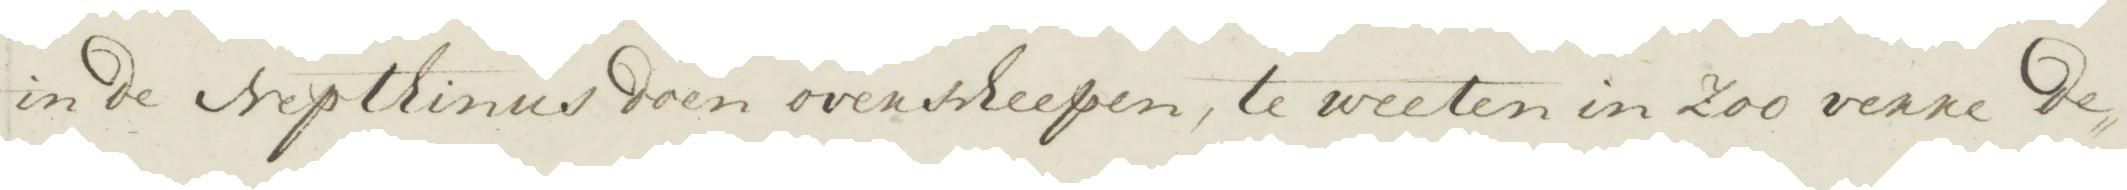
in de Nepthinus doen overscheepen, te weeten in zoo verre de„
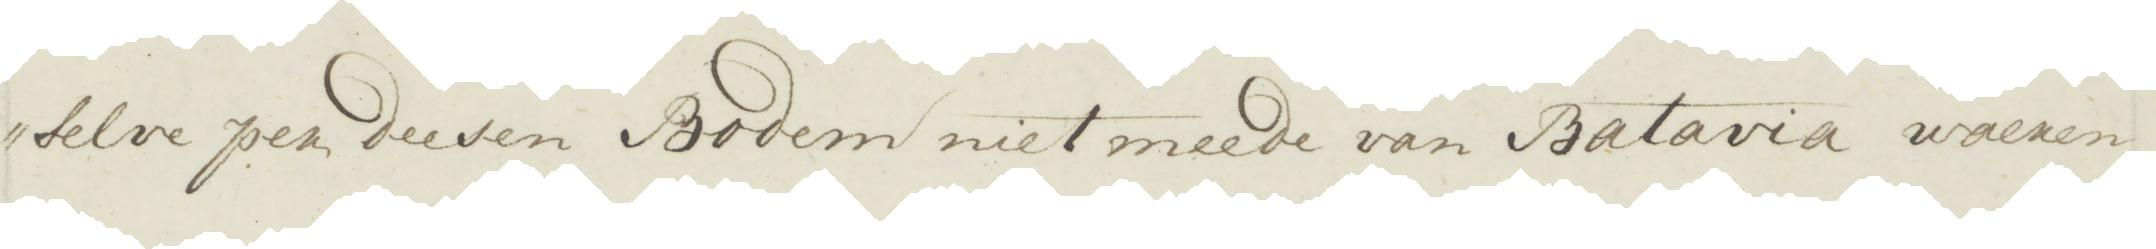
„selve per deesen Bodem niet meede van Batavia waeren
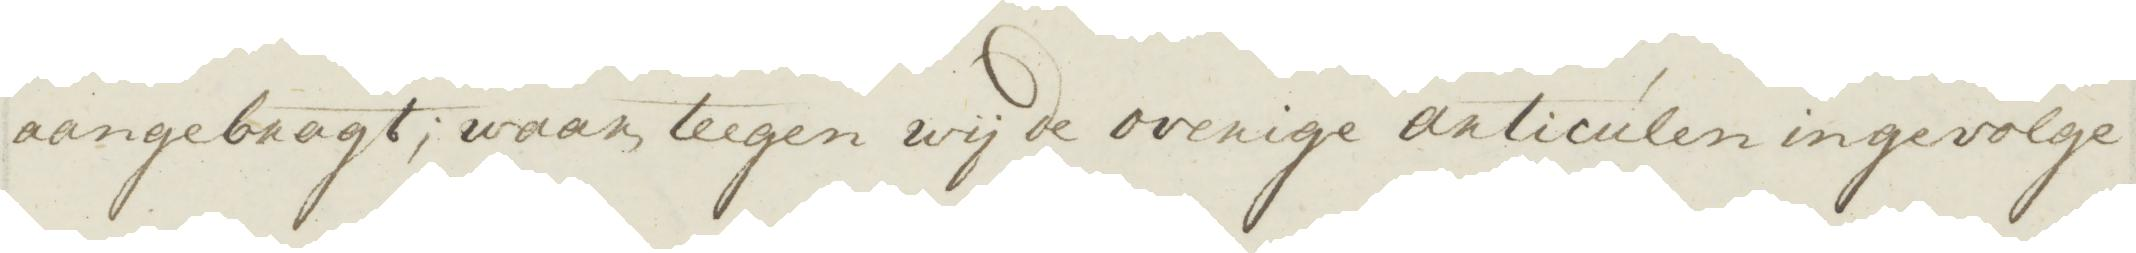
aangebragt; waar teegen wij de overige articulen ingevolge
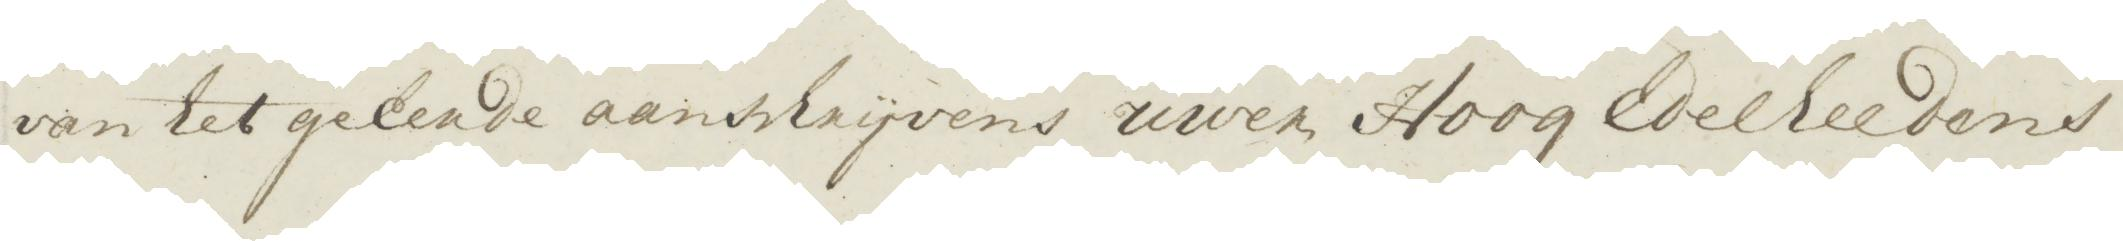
van het geEerde aanschrijvens uwer Hoog Edelheedens
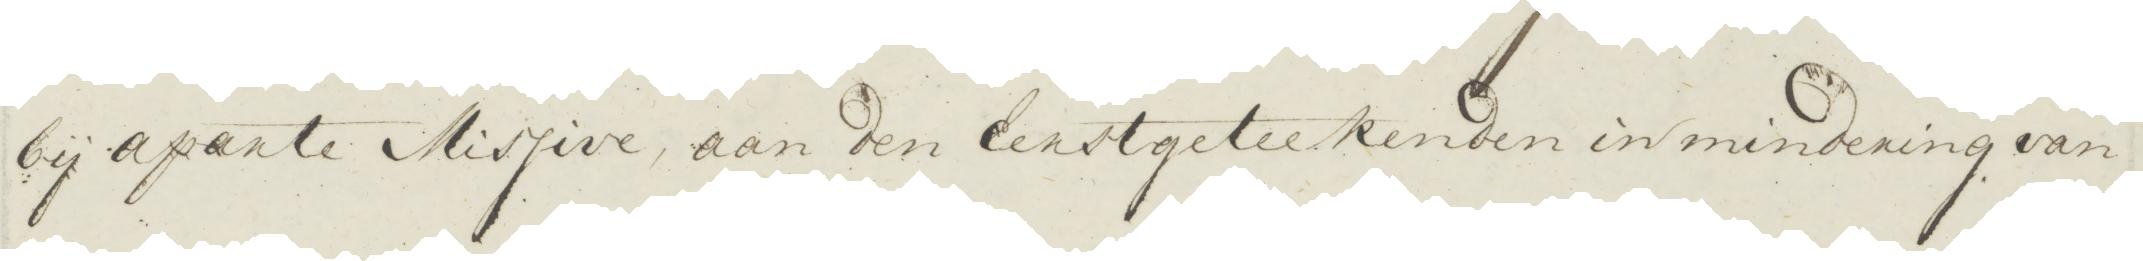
bij aparte Missive, aan den Eerstgeteekenden in mindering van
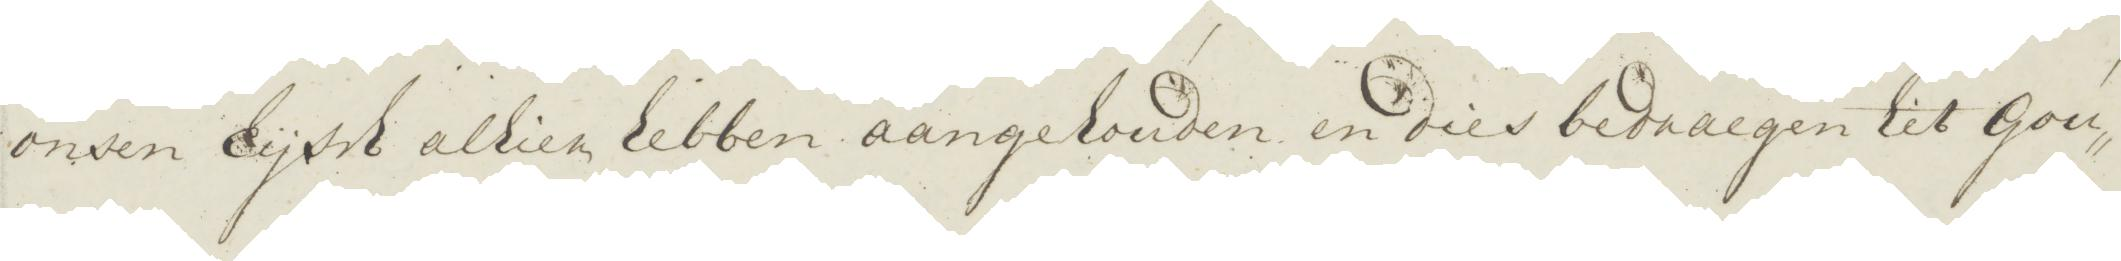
onsen Eijsch alhier hebben aangehouden en dies bedraegen het gou„
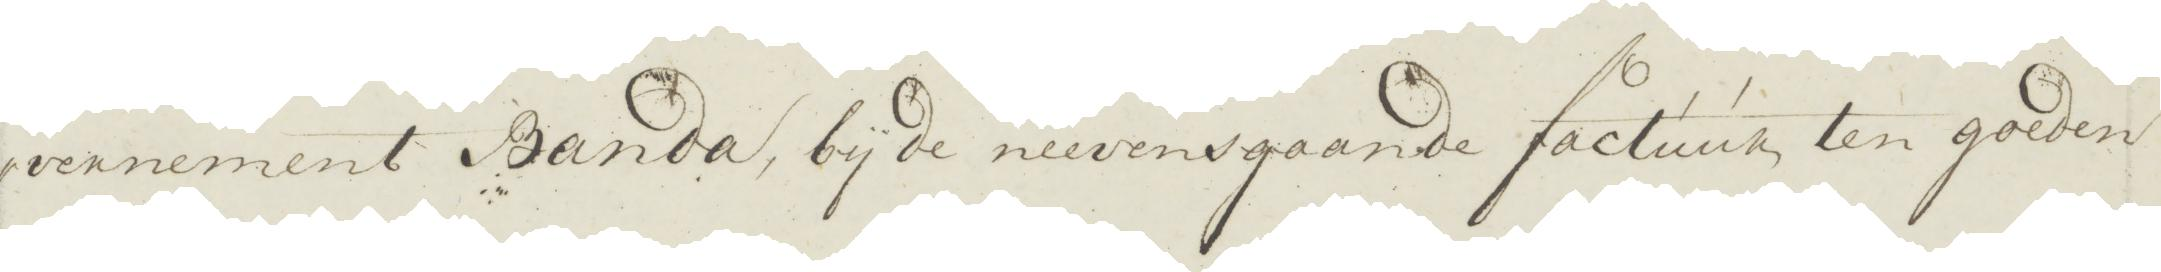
vernement Banda, bij de neevensgaande factuur ten goeden
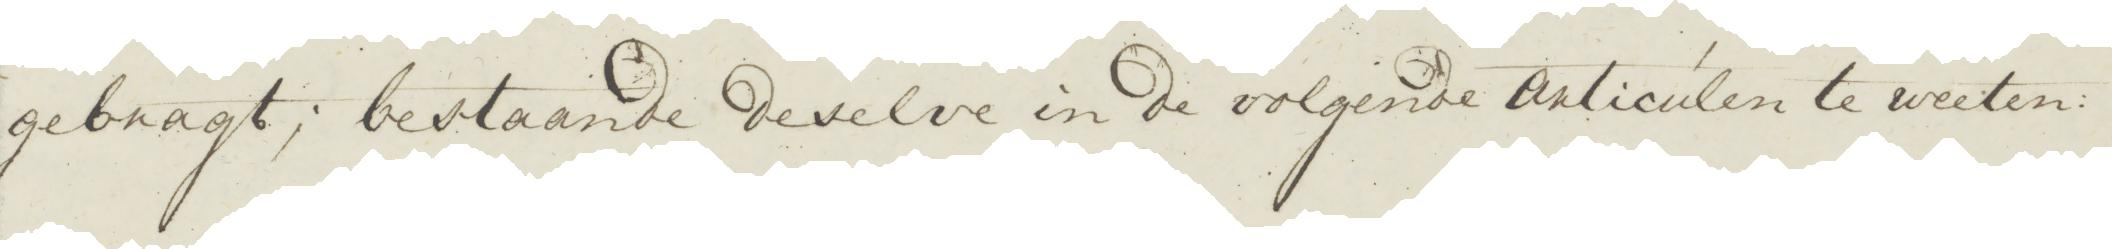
gebragt; bestaande deselve in de volgende articulen te weeten:
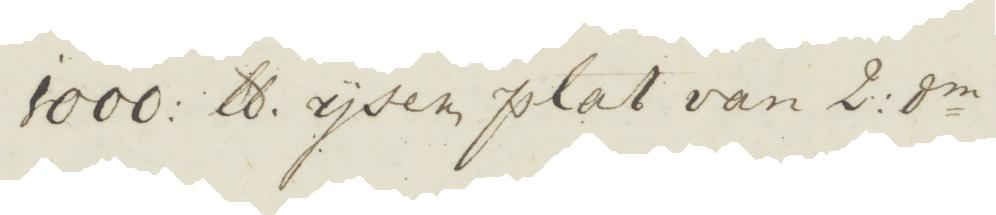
1000: lb. ijser plat van 2: d=m
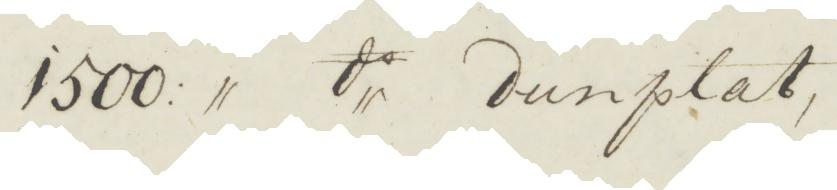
1500: „ d„o dunplat,
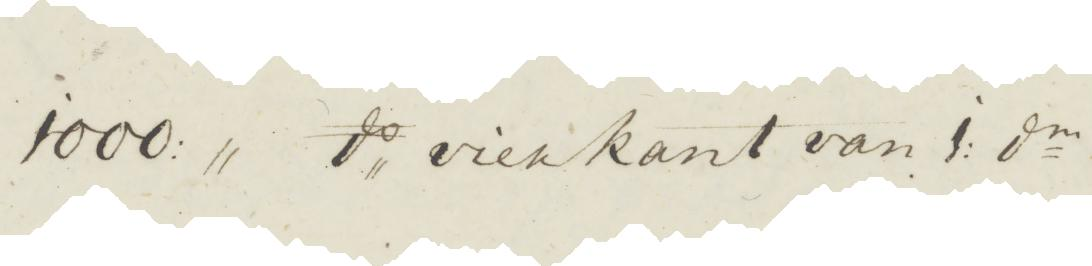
1000: „ d„o vierkant van 1: d=m
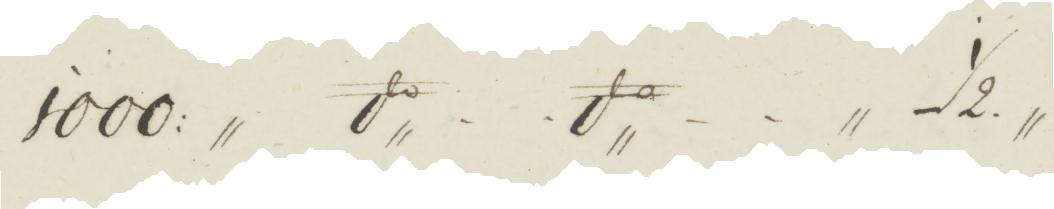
1000: „ d„o - - d„o - - „ ½. „
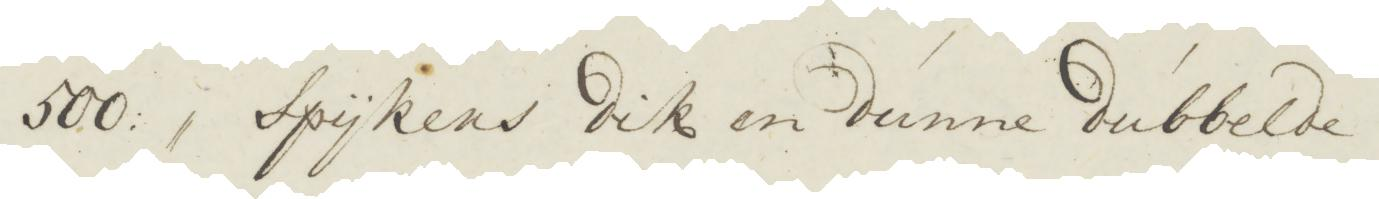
500: „ spijkers dik en dunne dubbelde
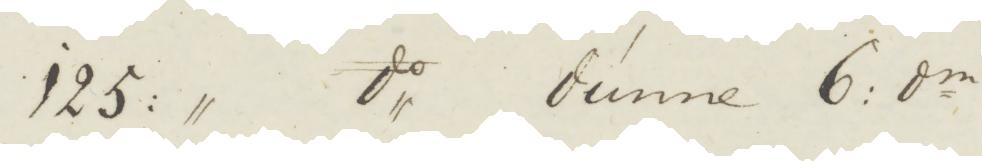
125: „ d„o dunne 6: d=m
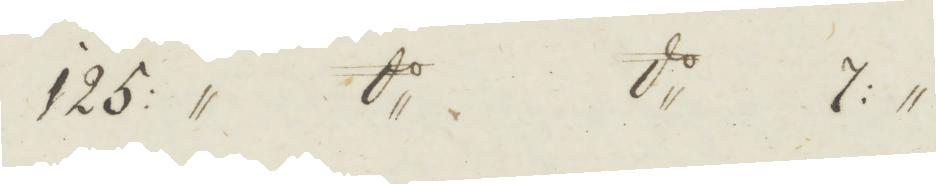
125: „ . d„o d„o 7: „
